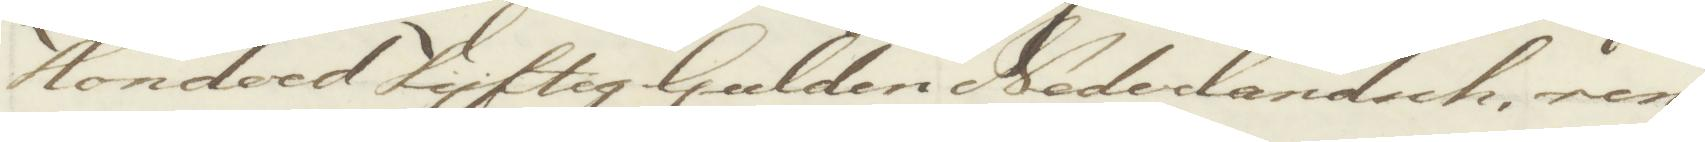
Honderd Vijftig Gulden Nederlandsch, ren
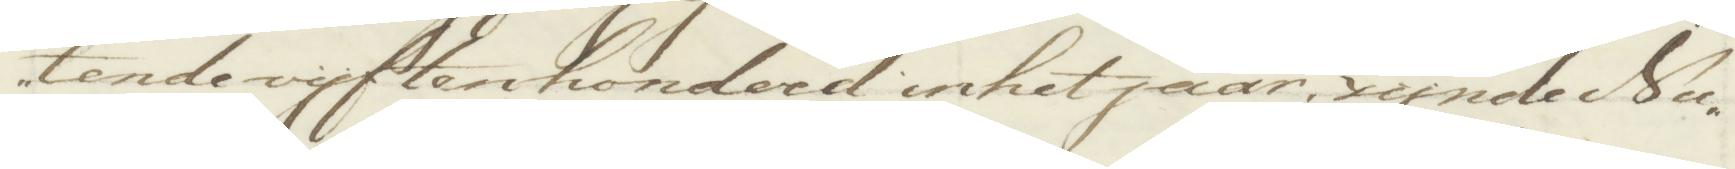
„tende vijf ten honderd in het jaar, zijnde Nu„
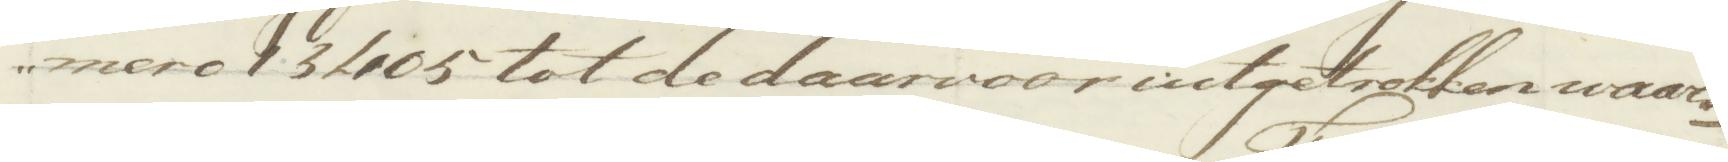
„mero 13405 tot de daarvoor uitgetrokken waar„
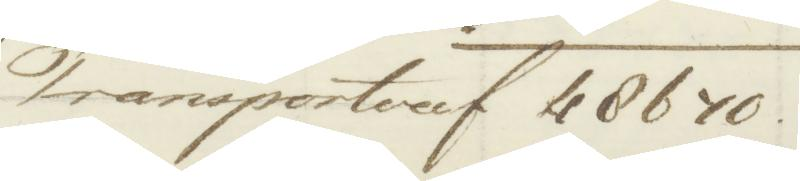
Transportere ƒ 48670.
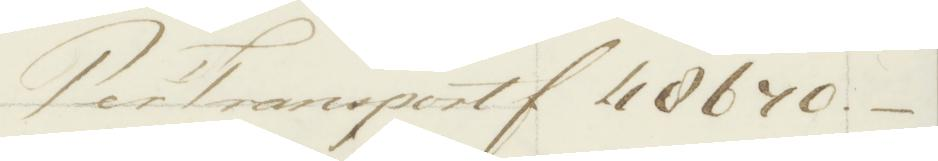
Per transport ƒ 48670. —
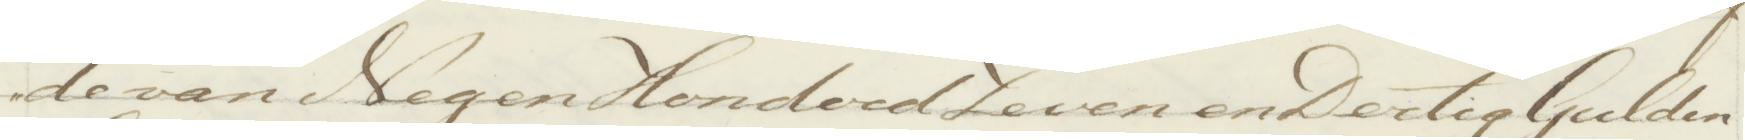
„de van Negen Honderd Zeven en Dertig Gulden
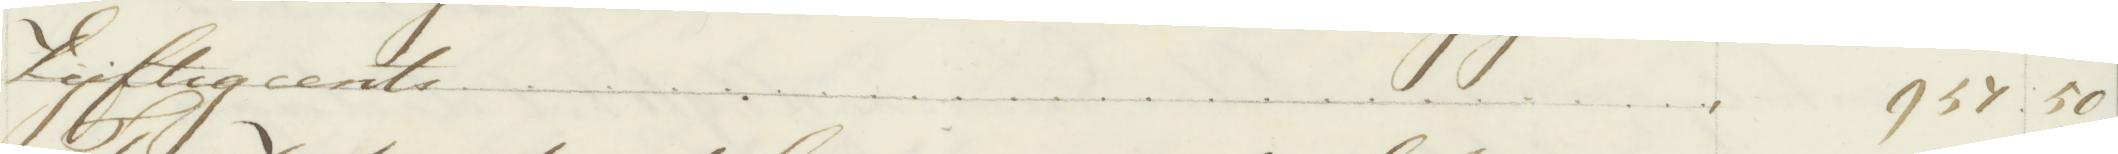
Vijftig cents . . . . . . . . . . . . . . . . . . . . . . . . . , 957: 50
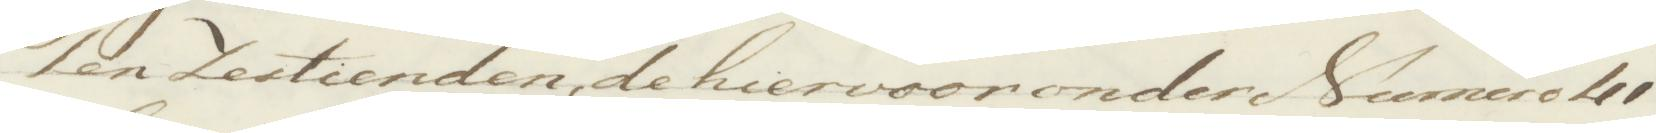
Ten Zestienden, de hiervoor onder Numero 41
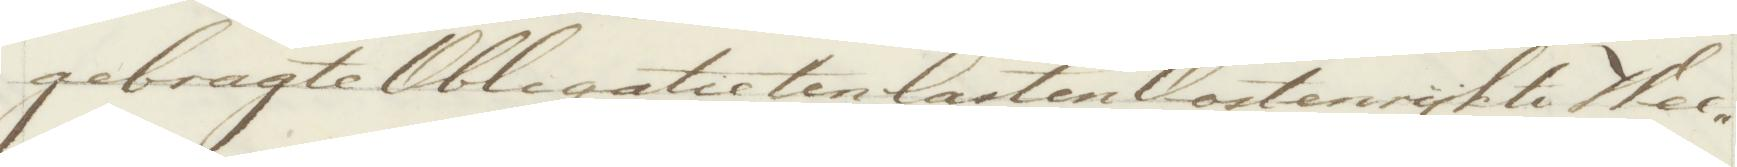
gebragte Obligatie ten lasten Oostenrijkte Wee„
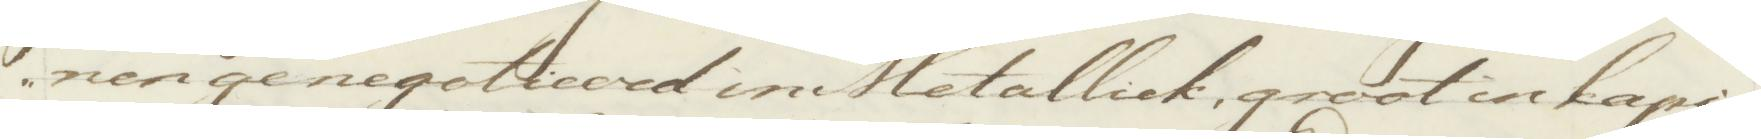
„nen genegotieerd in Metalliek, groot in kapi„
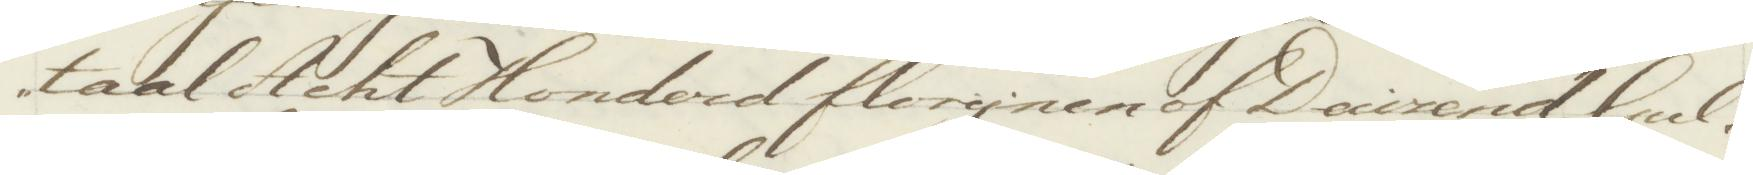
„taal Acht Honderd florijnen of Duizend Gul„
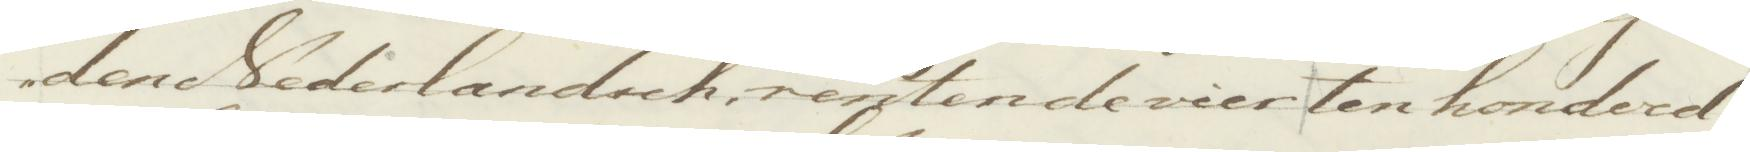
„den Nederlandsch, rentende vier|ten honderd
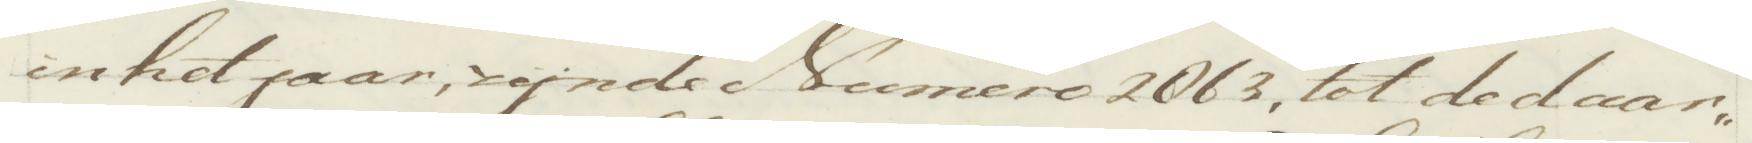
in het jaar, zijnde Numero 2863, tot de daar„
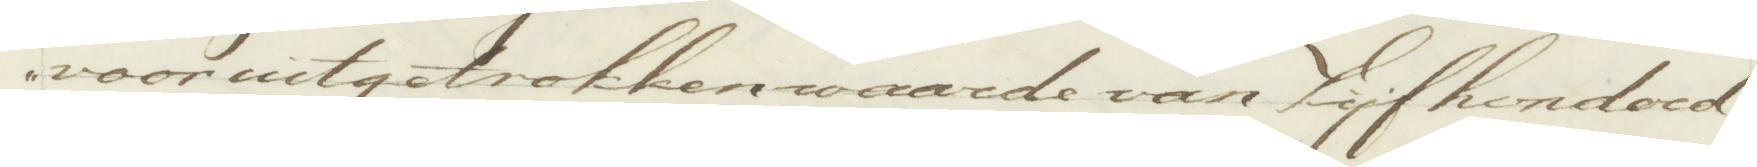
„voor uitgetrokken waarde van Vijf honderd
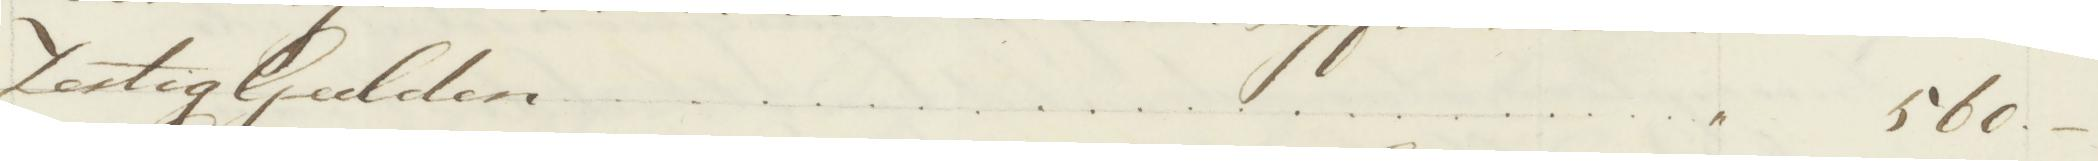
Zestig Gulden . . . . . . . . . . . . . . . . . . . . . . . „ 560. —
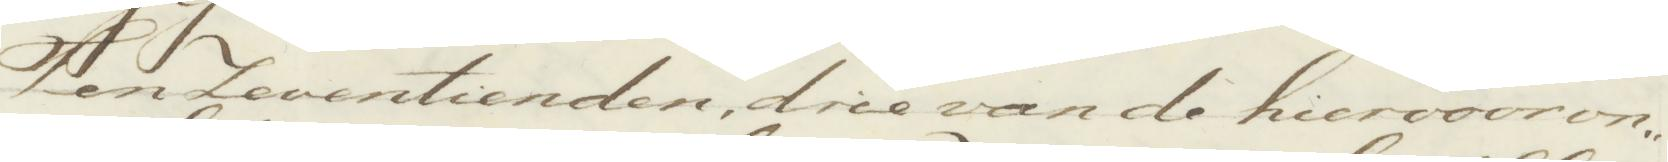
Ten Zeventienden, drie van de hiervoor on„
